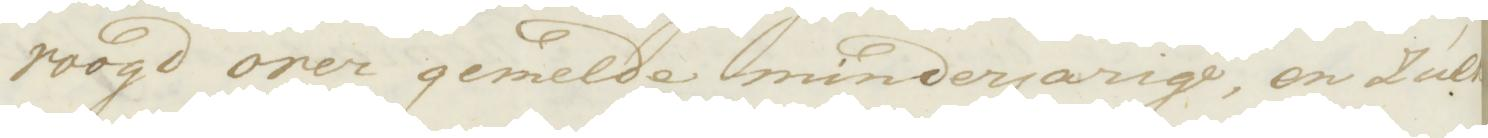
voogd over gemelde minderjarige, en zul
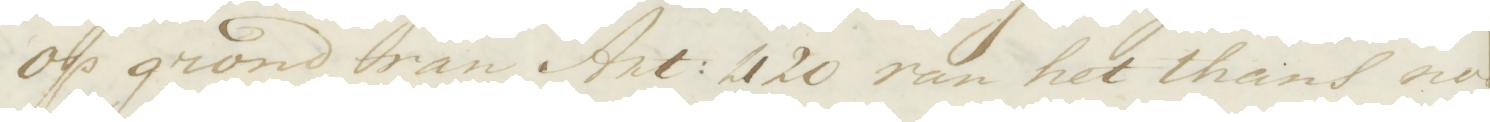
op grond van Art: 420 van het thans no
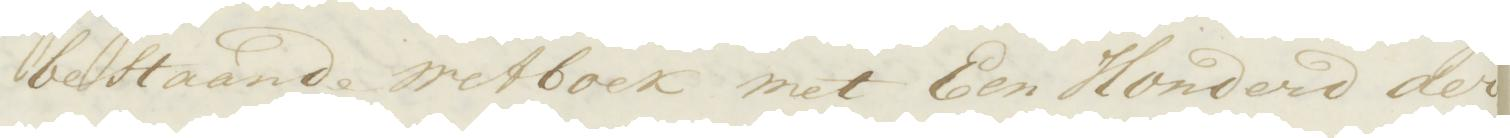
bestaande wetboek met Een Honderd der
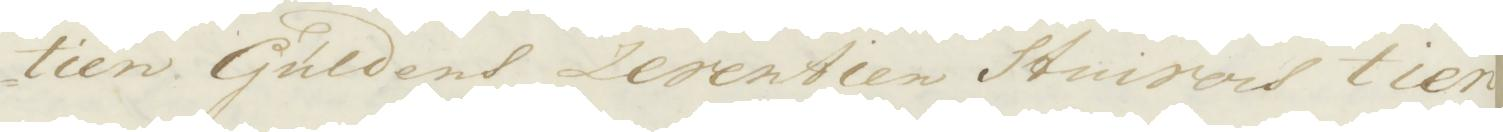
=tien Guldens zeventien stuivers tien
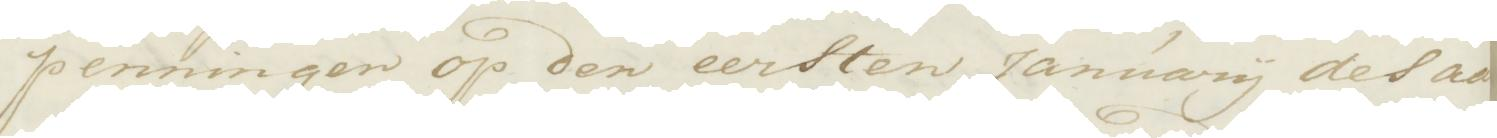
penningen op den eersten januarij des aa
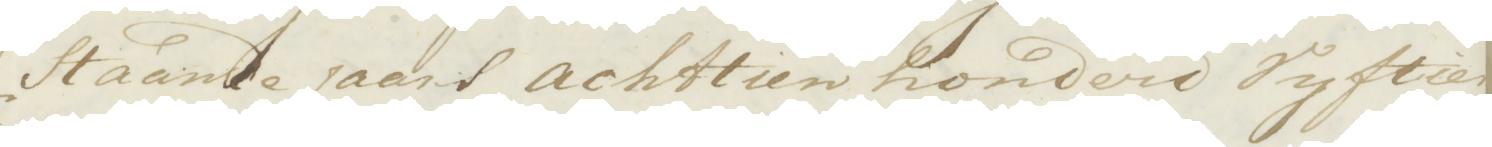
=staande jaars achttien honderd Vijftien
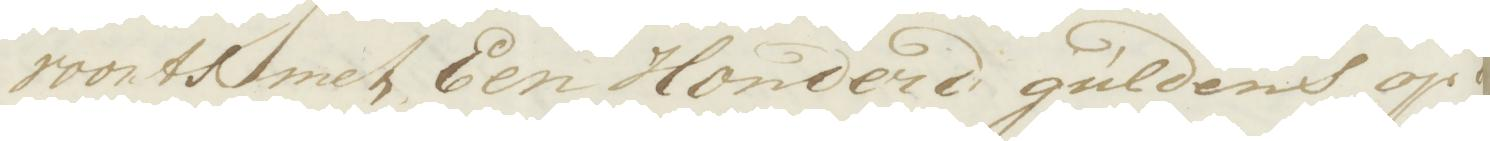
voorts met Een Honderd guldens op
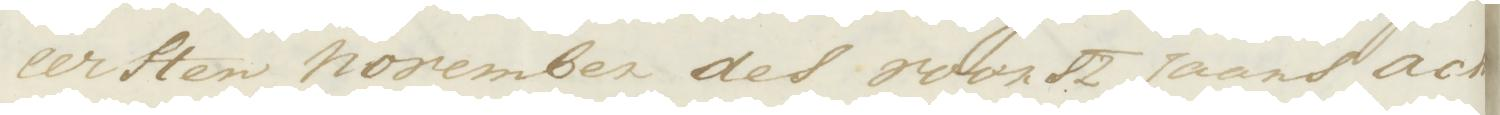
eersten november des voorsz jaars ach
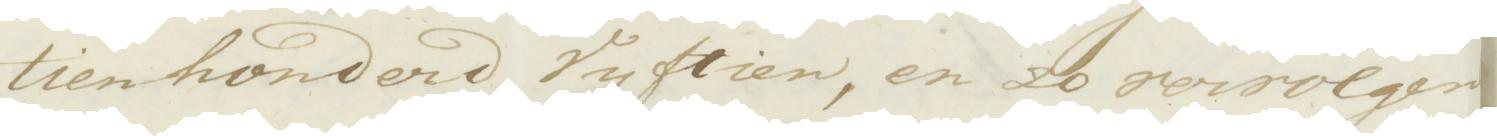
=tienhonderd Vijftien, en zo vervolgen
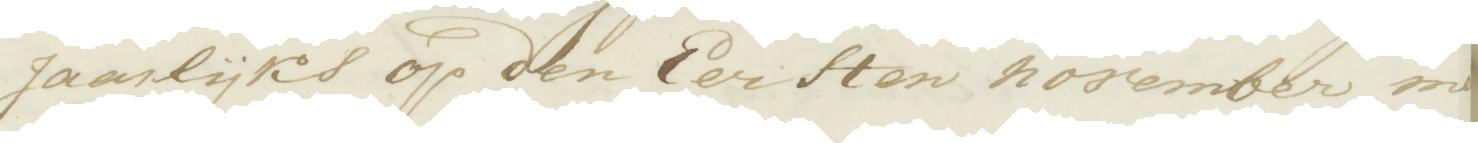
jaarlijks op den Eersten November m
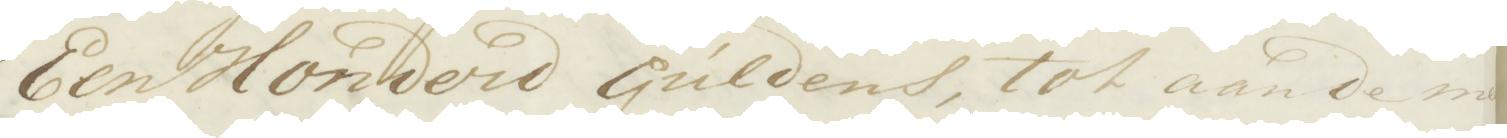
Een Honderd guldens, tot aan de m
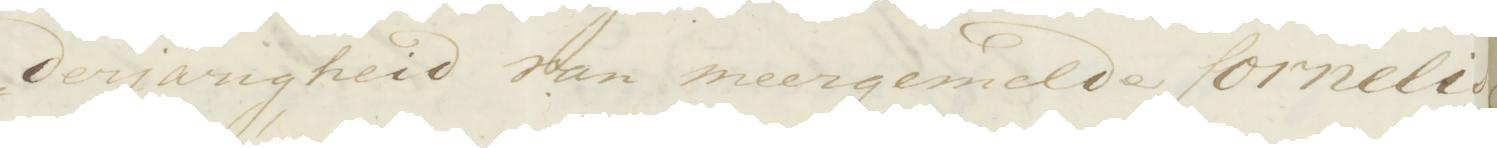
=derjarigheid van meergemelde Corneli
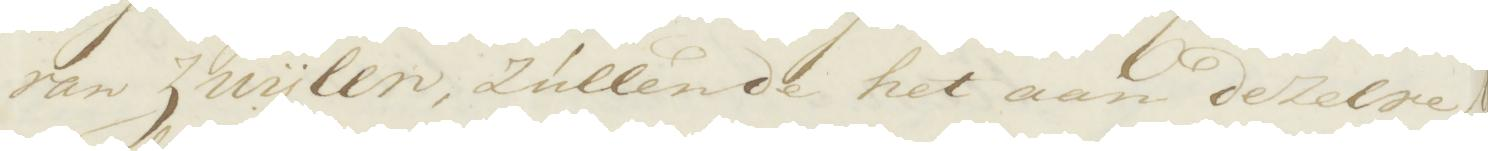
van Zuijlen, zullende het aan dezelve
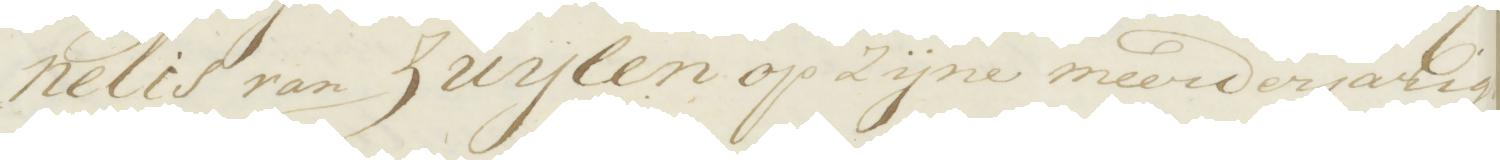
=nelis van Zuijlen op zijne meerderjarig
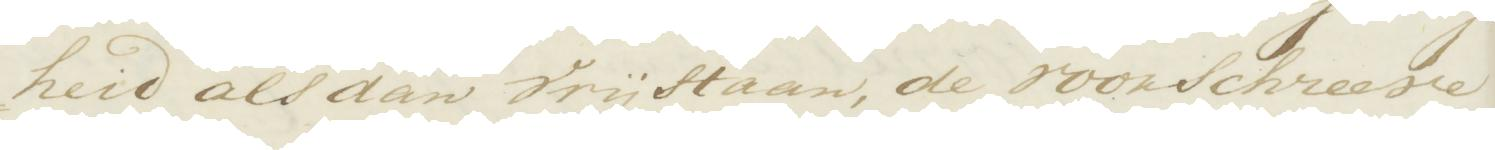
=heid als dan vrijstaan, de voorschreeve
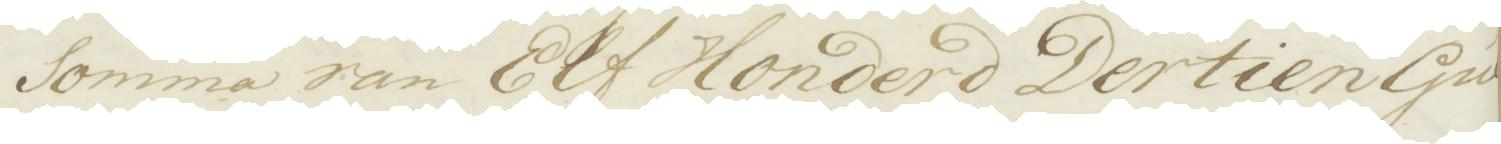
somma van Elf Honderd Dertien Gu
